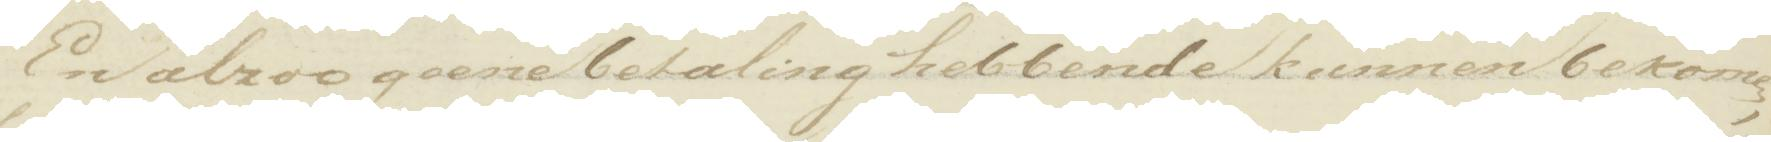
En alzoo geene betaling hebbende kunnen bekomen,
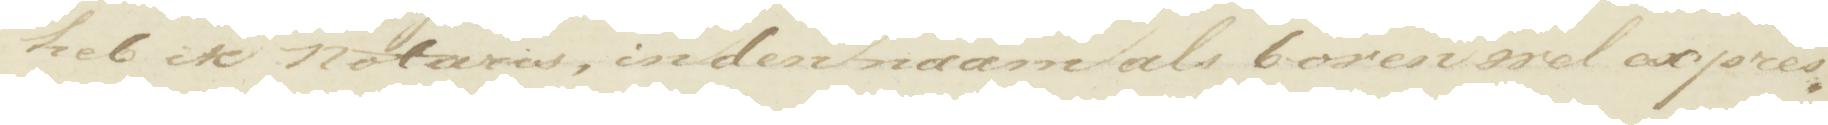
heb ik Notaris, in den naam als boven wel expres„
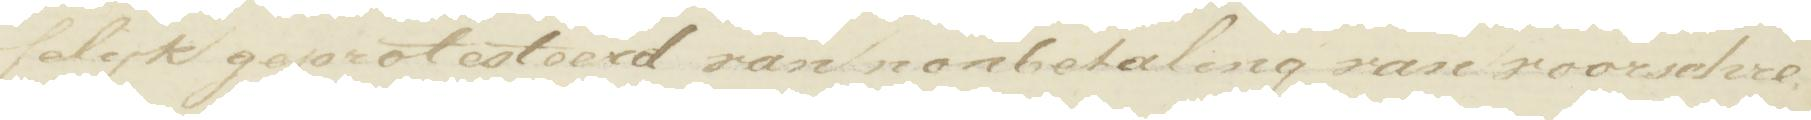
selyk geprotesteerd van nonbetaling van voorschre
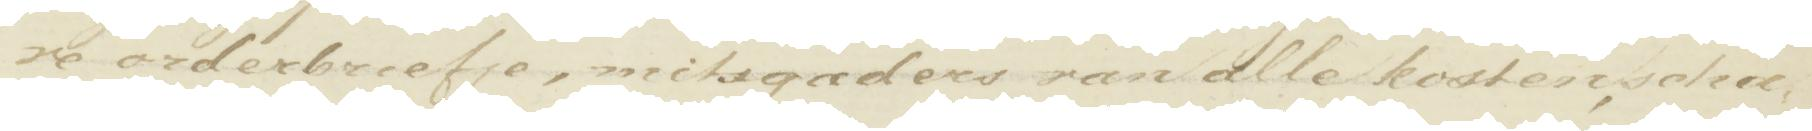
ve orderbriefje, mitsgaders van alle kosten, scha
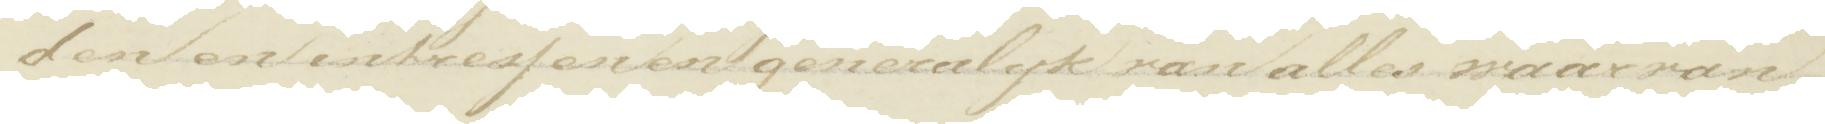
den en intressen en generalyk van alles waarvan
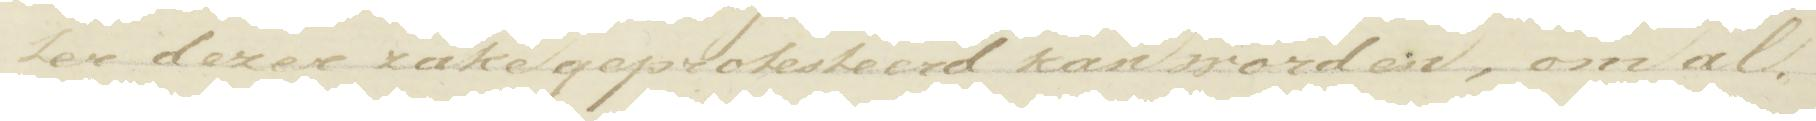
ter dezer zake geprotesteerd kan worden, om al„
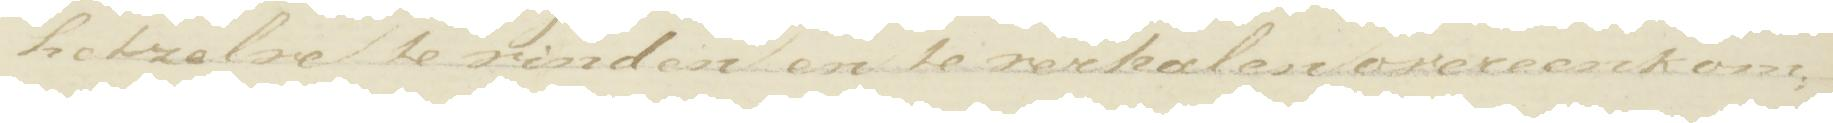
hetzelve te vinden en te verhalen overeenkom
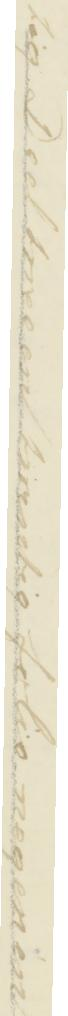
tig Deel tweeentachtig folio negenen
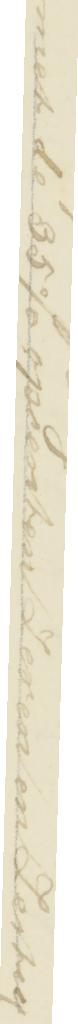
met de 35% openten Zeven en Zestig
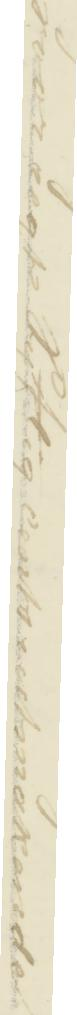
voor regt Vyftig cents uitmakende
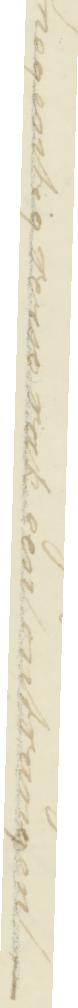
negentig verso vak een ontvangen
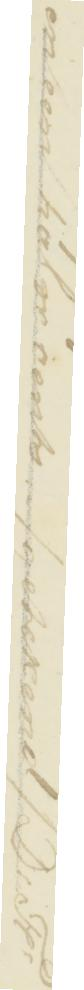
en een halve cents / getekend / D F
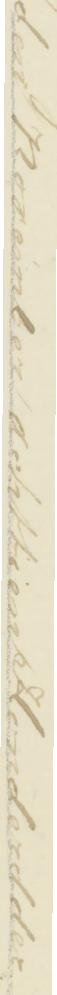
den November achttien Honderdder
